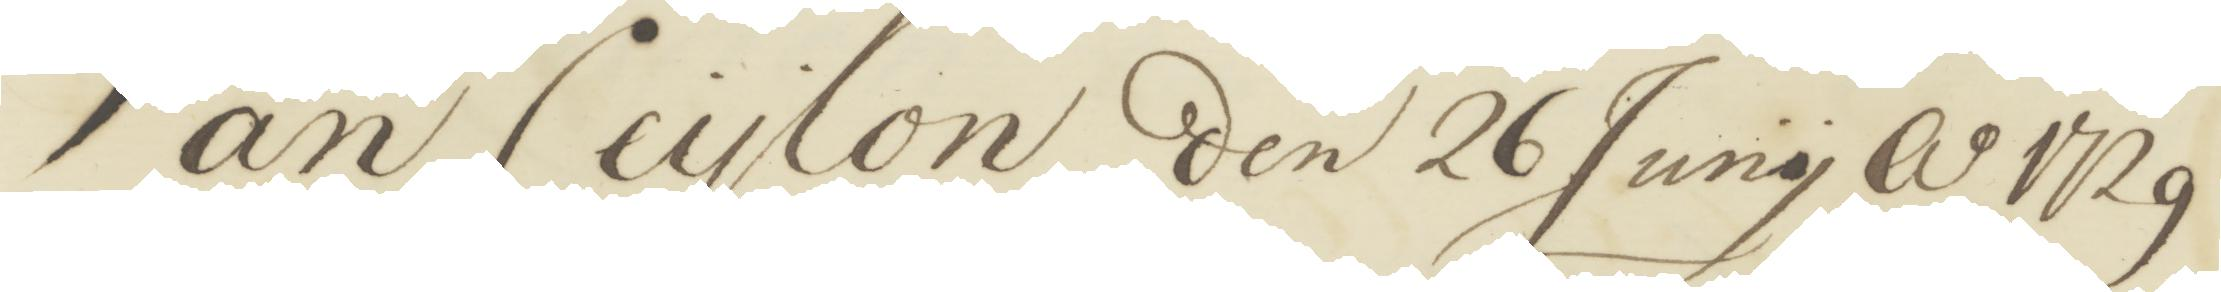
Van Ceijlon den 26 Junij A:o 1729
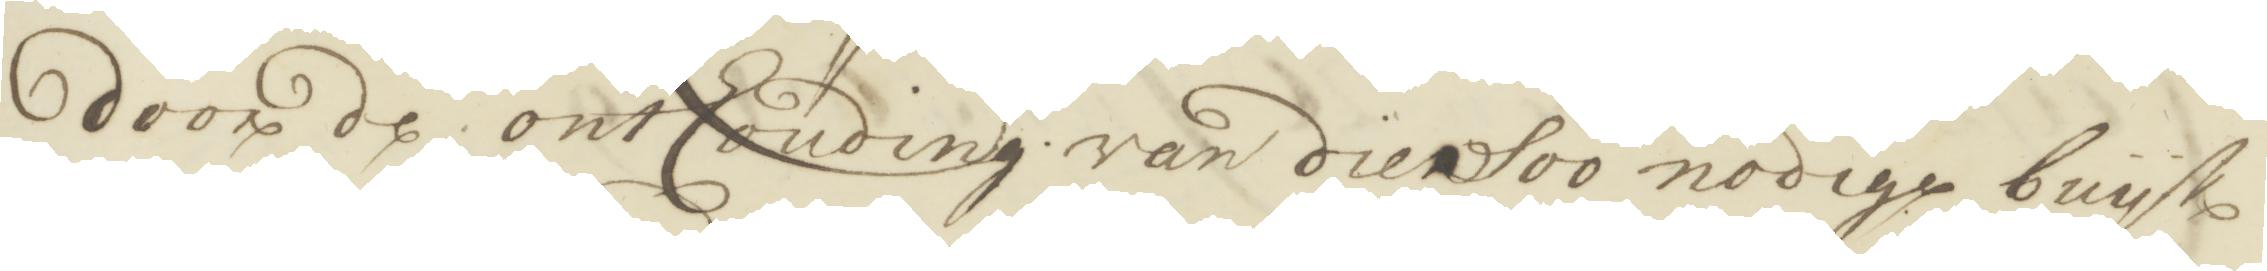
door de onthouding van dieze Soo nodige buijk
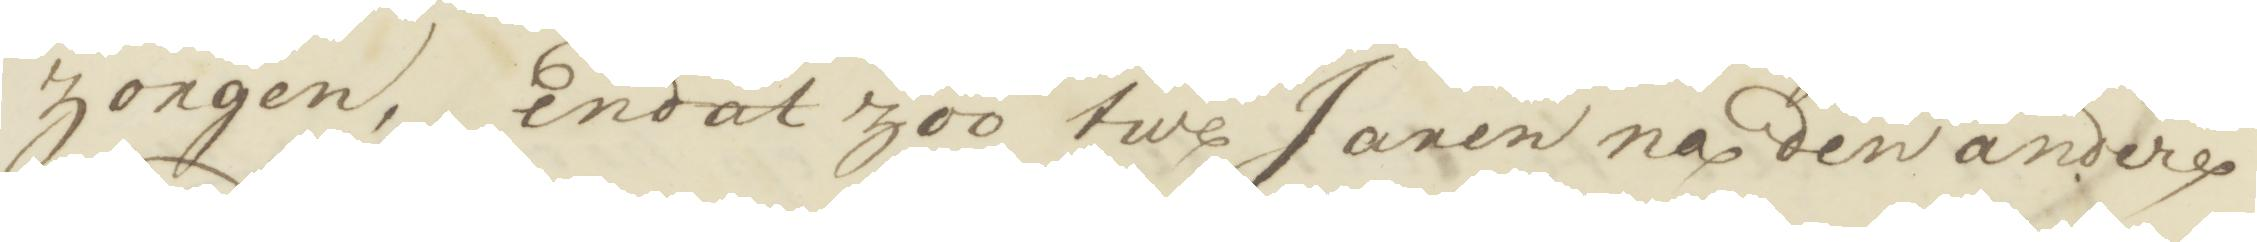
zorgen, en dat zoo twe Jaren na den andere
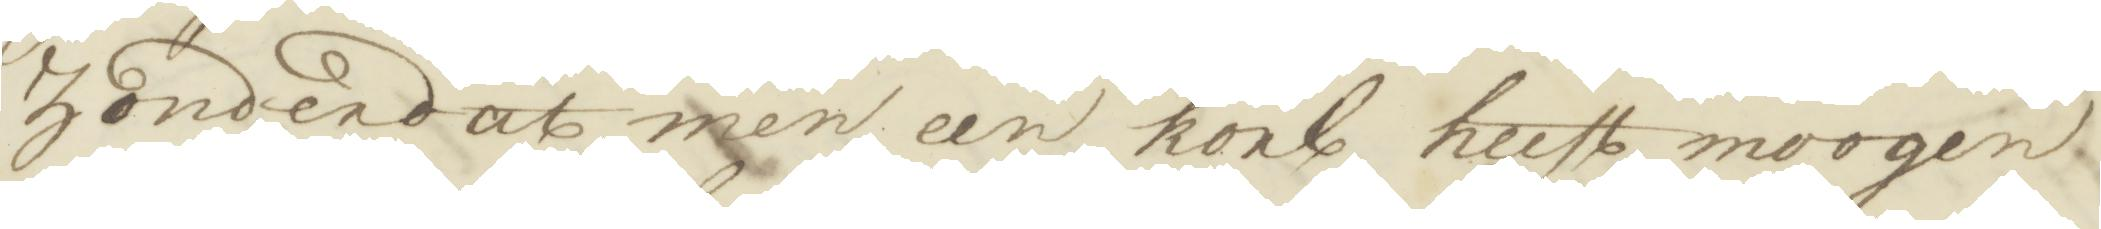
Zonder dat men een korl heeft moogen
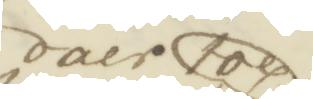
daer toe
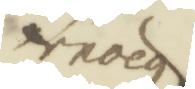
vroeg
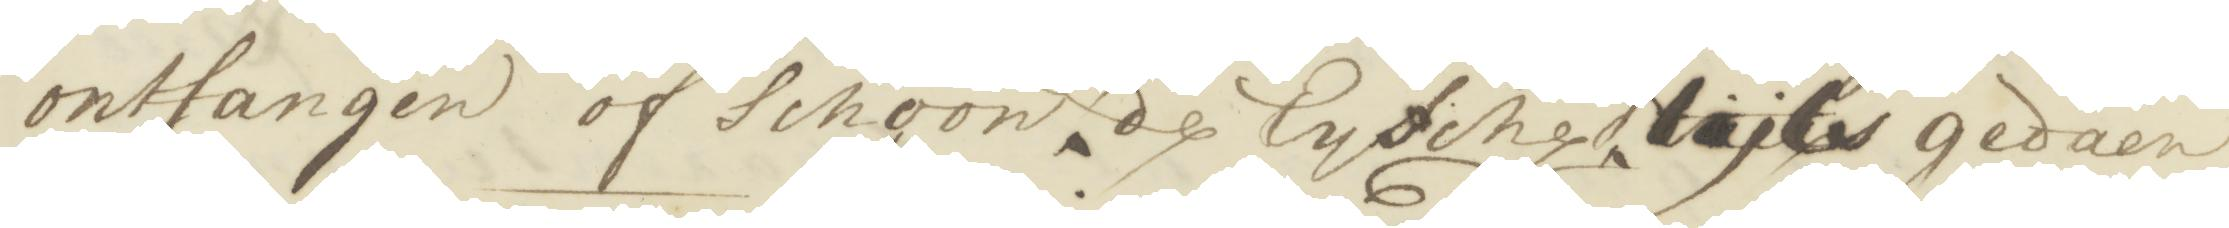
ontfangen of Schoon ^ de Eysche ^ tijts gedaen
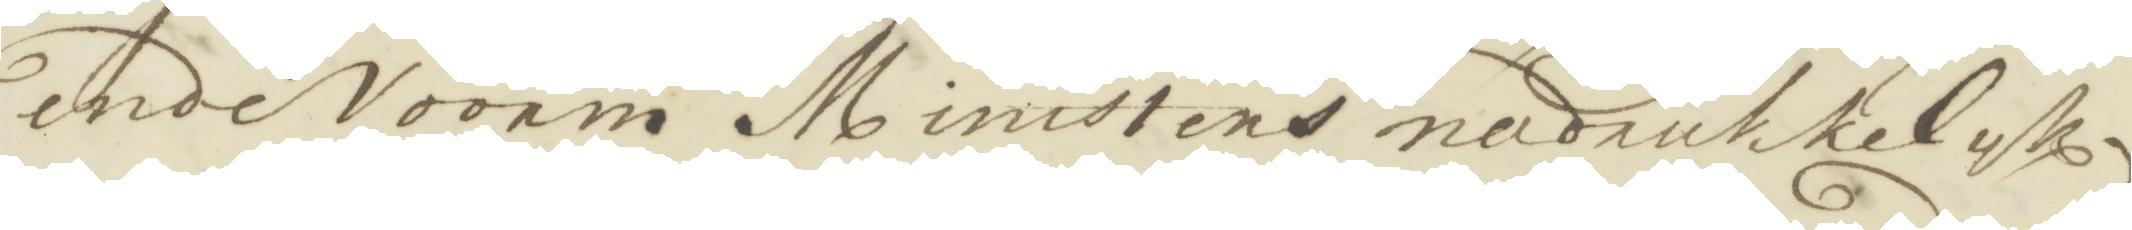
ende Voorm Ministers nadrukkelyk
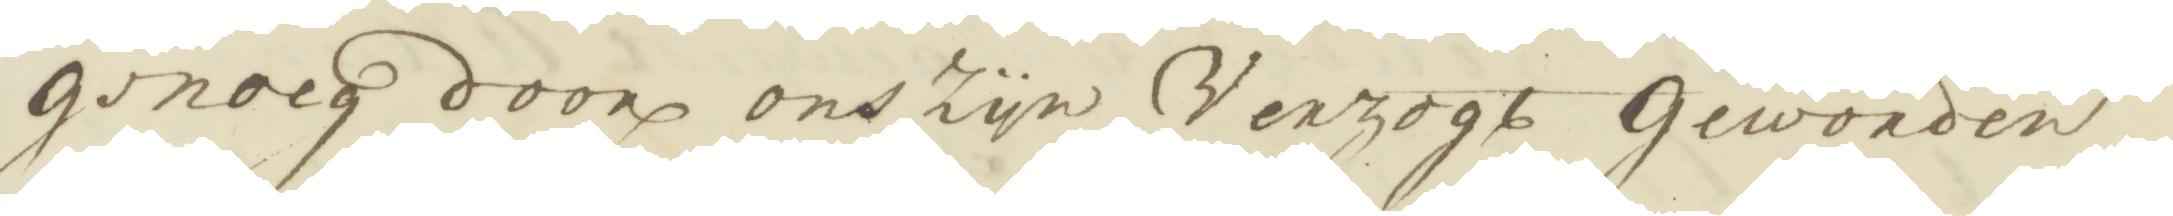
genoeg door ons Zijn Verzogt geworden
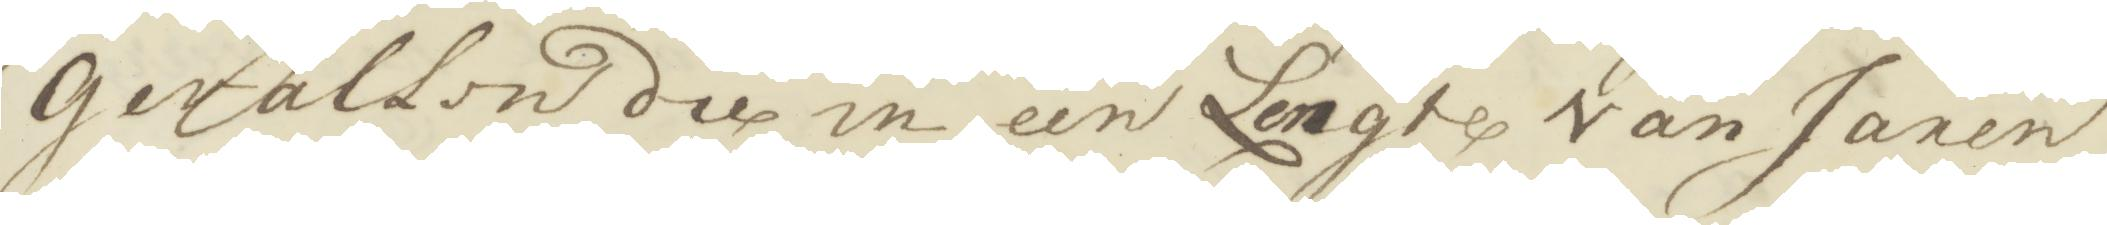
gevallen die in een Lengte van Jaren
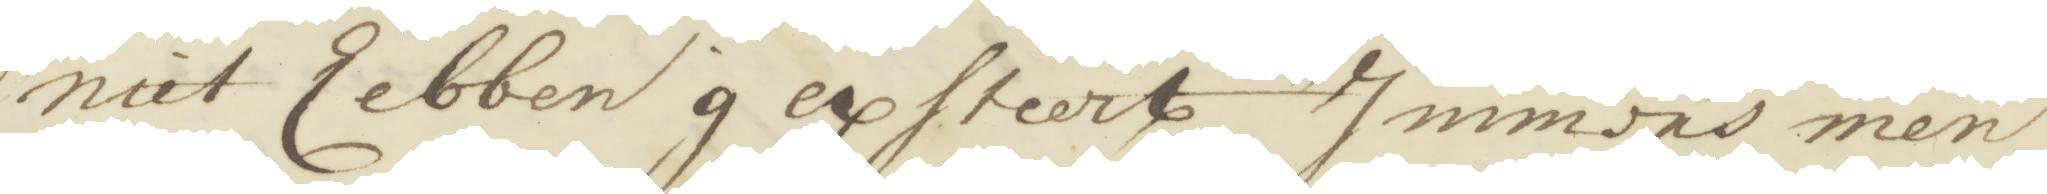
niet hebben 'g exsteert Jmmers men
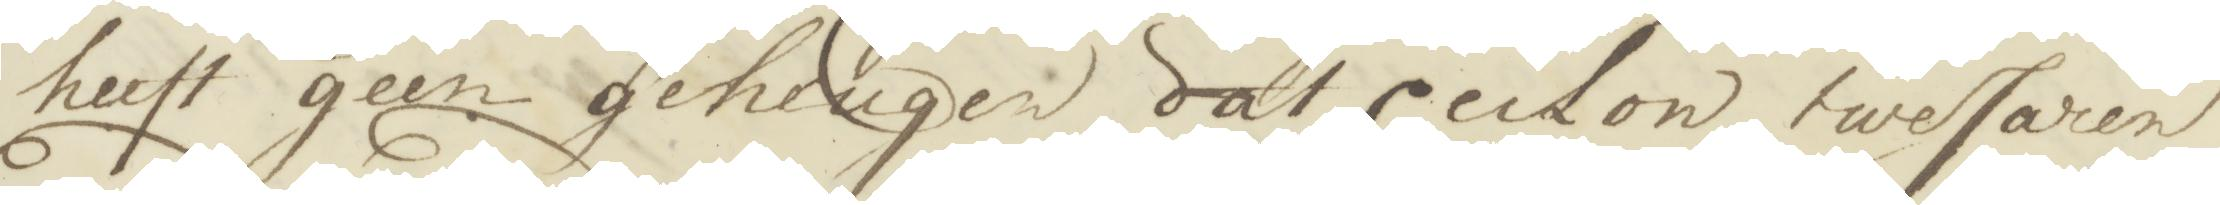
heeft geen geheugen dat Ceilon twe Jaren
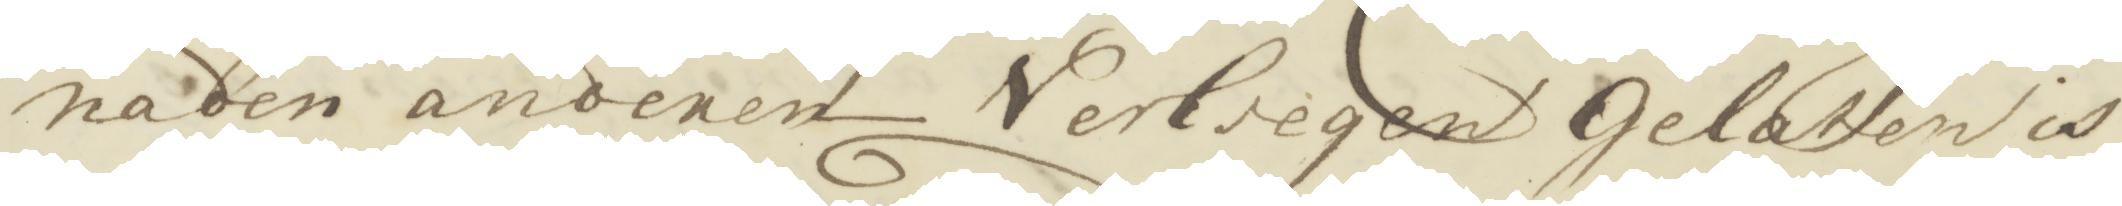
na den anderen Verleegen gelaten is
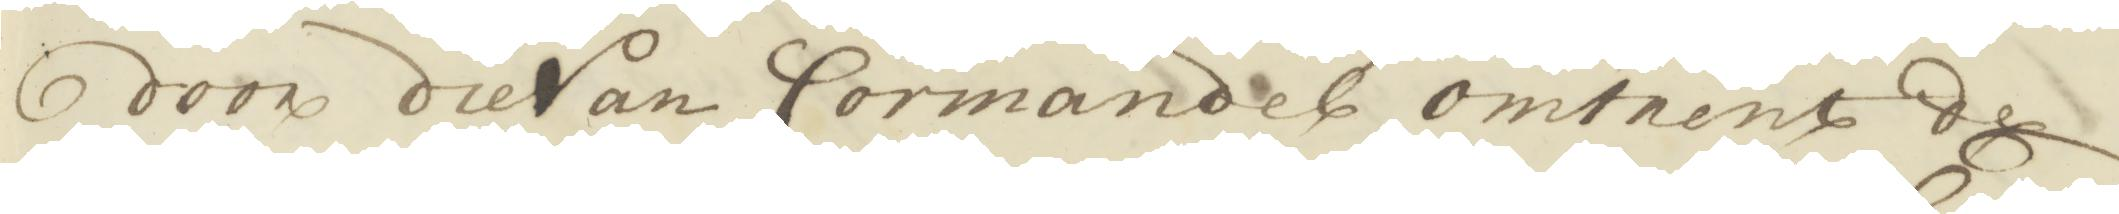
door die Van Cormandel omtrent de
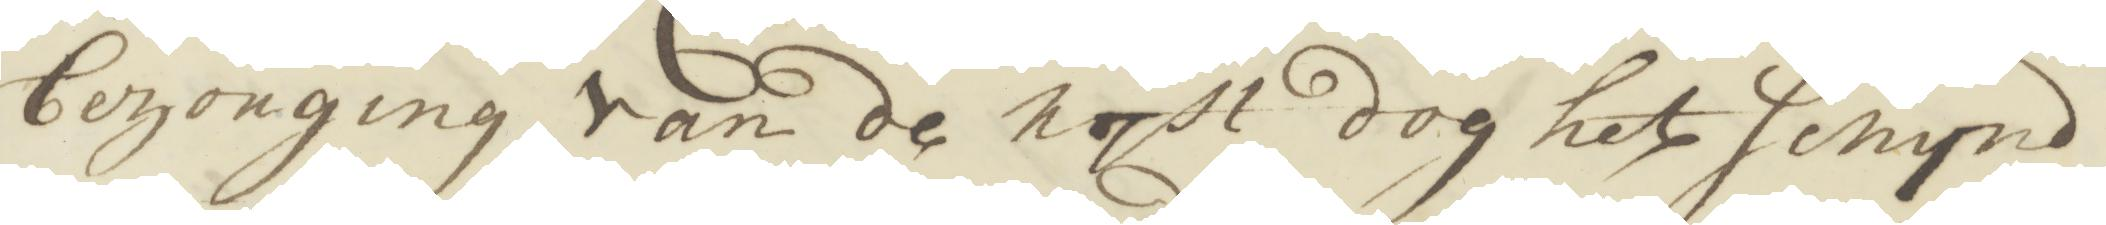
bezorging van de ryst dog het Schynd
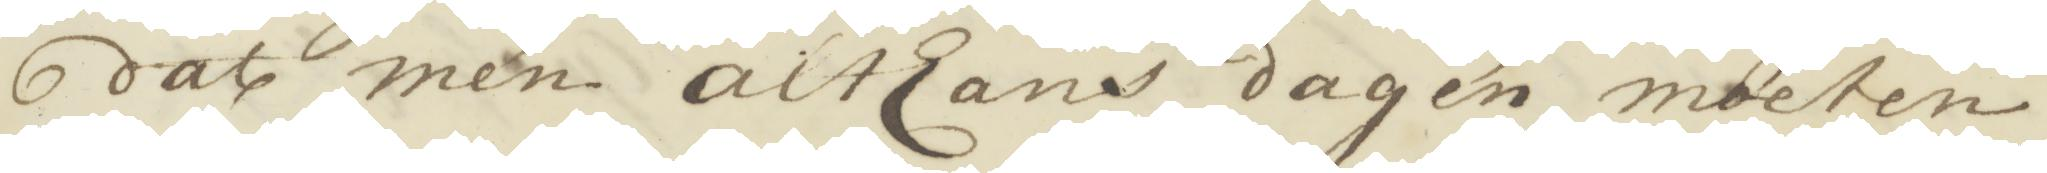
dat men althans dagen moeten
